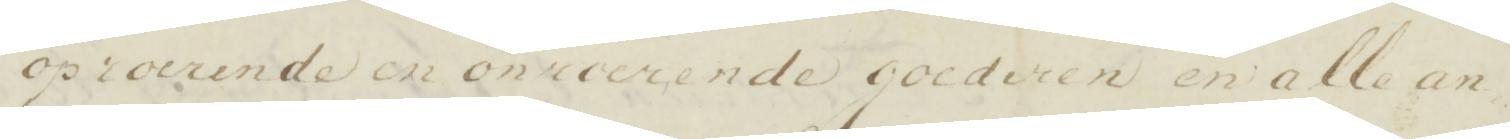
op roerende en onroerende goederen en alle an„
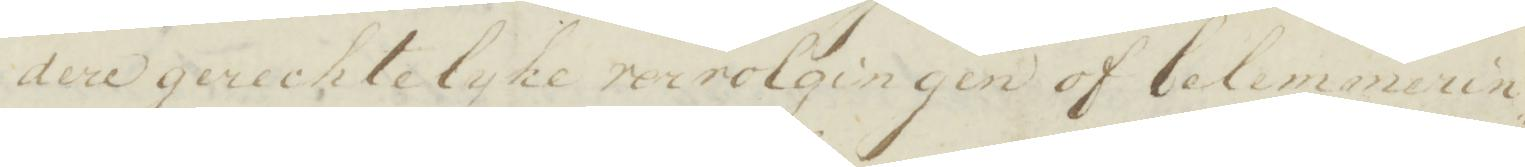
„dere gerechtelyke vervolgingen of belemmerin„
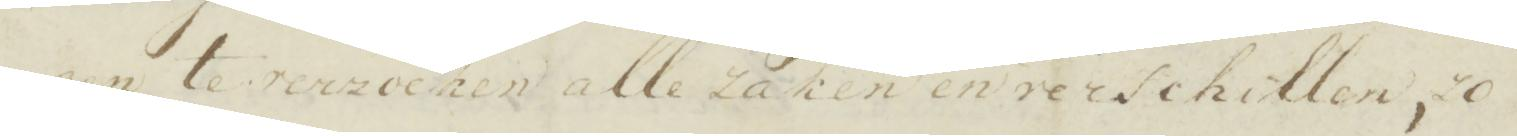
gen te verzoeken alle zaken en verschillen, zo
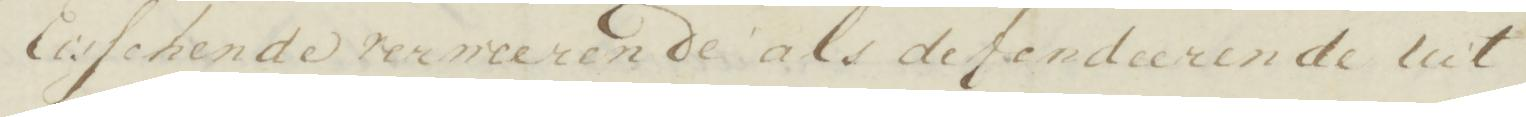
Eisschende verweerende als defendeerende uit
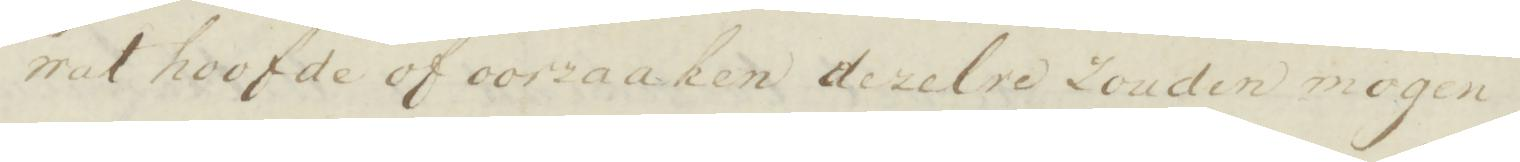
wat hoofde of oorzaaken dezelve zouden mogen
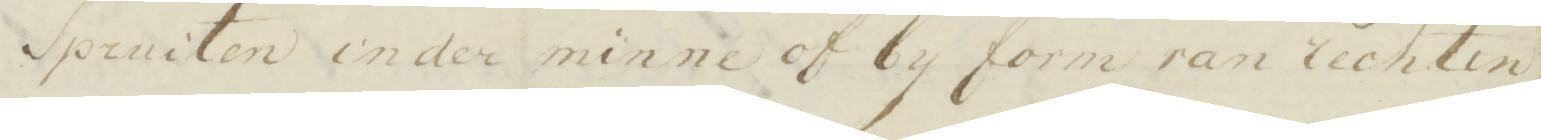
spruiten inder minne of by form van rechten
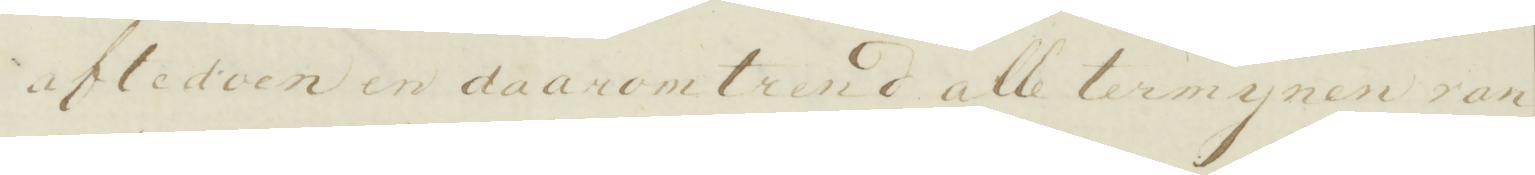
aftedoen en daaromtrend alle termynen van
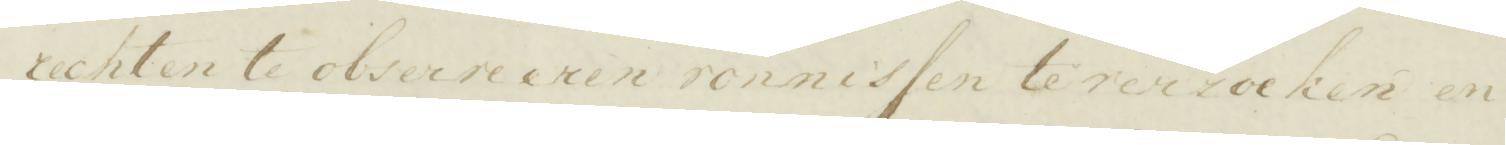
rechten te observeeren vonnissen te verzoeken en
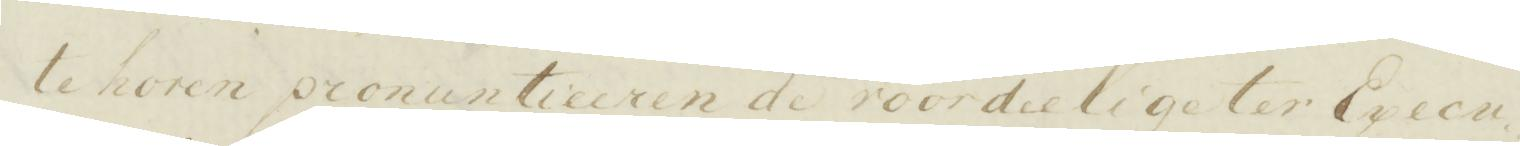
te horen pronuntieeren de voordeelige ter Execu„
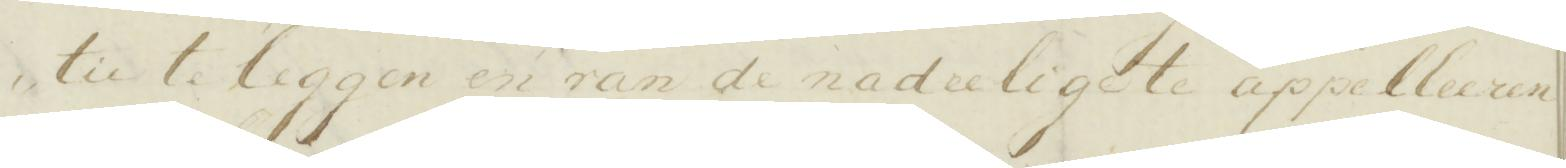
„tie te liggen en van de nadeelige te appelleeren
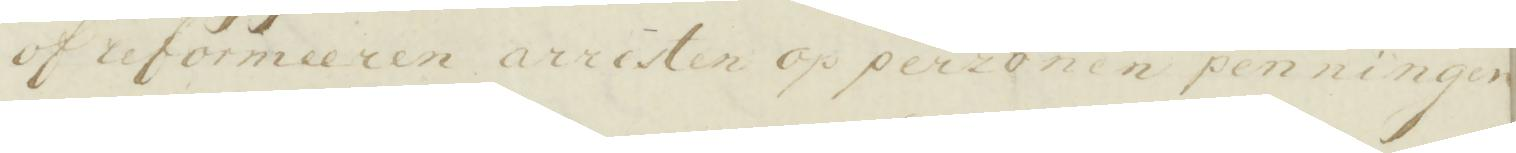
of reformeeren arresten op perzonen penningen
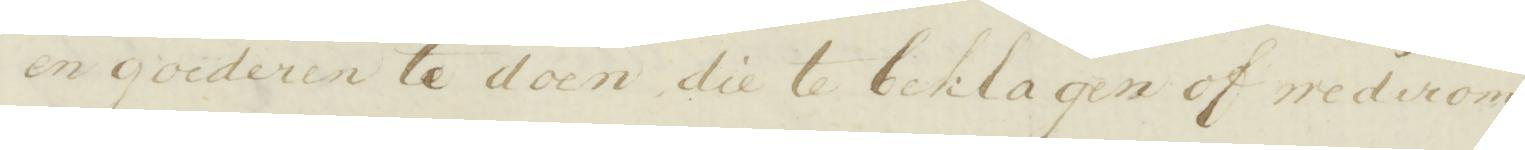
en goederen te doen, die te beklagen of wederom
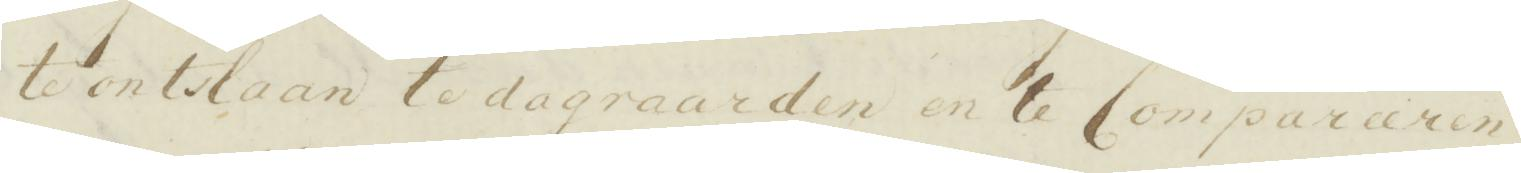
te ontslaan te dagvaarden en te Compareeren
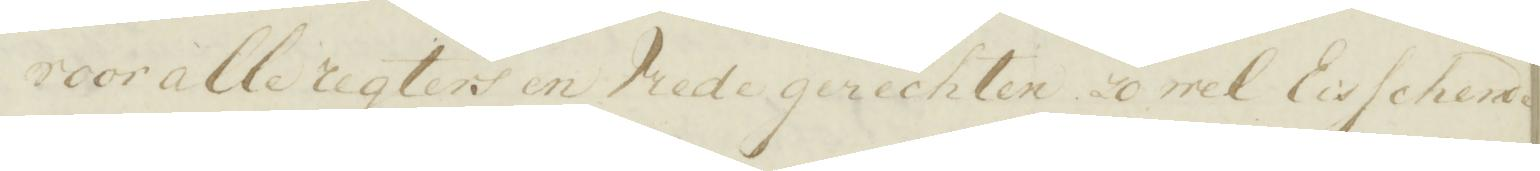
voor alle regters en Vrede gerechten, zo wel Eisschend
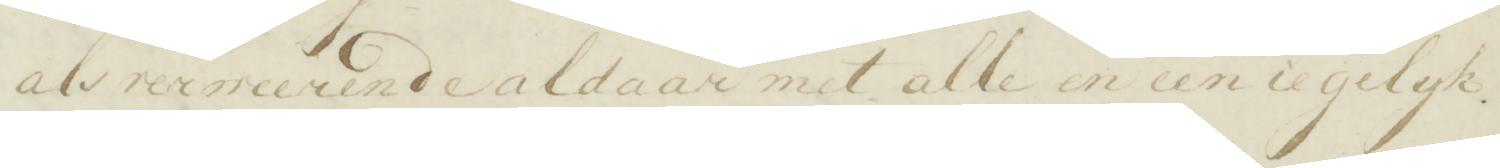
als verweerende aldaar met alle en een iegelyk.
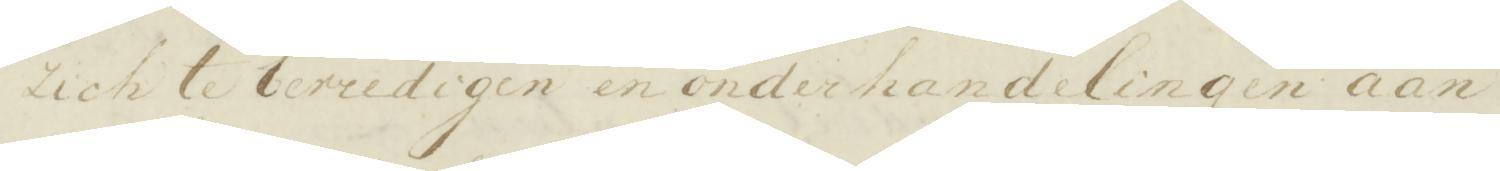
zich te bevredigen en onderhandelingen aan
